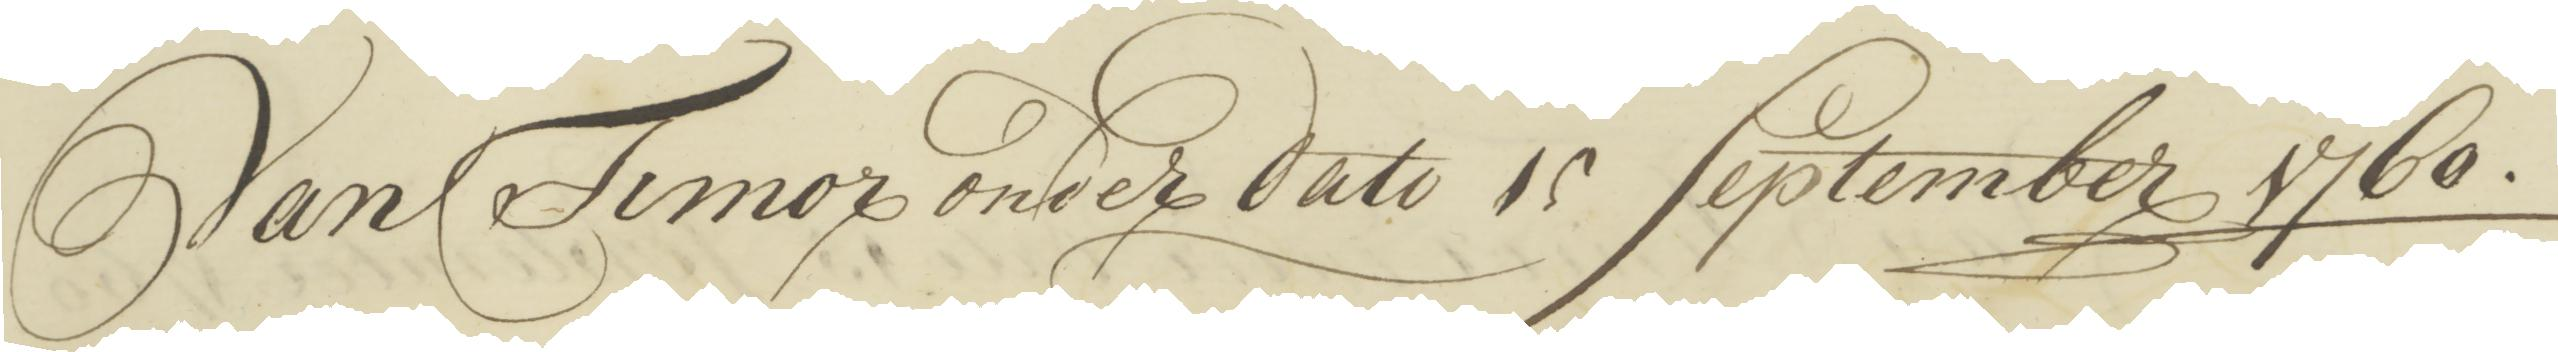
Van Timor onder dato 15 September 1760.
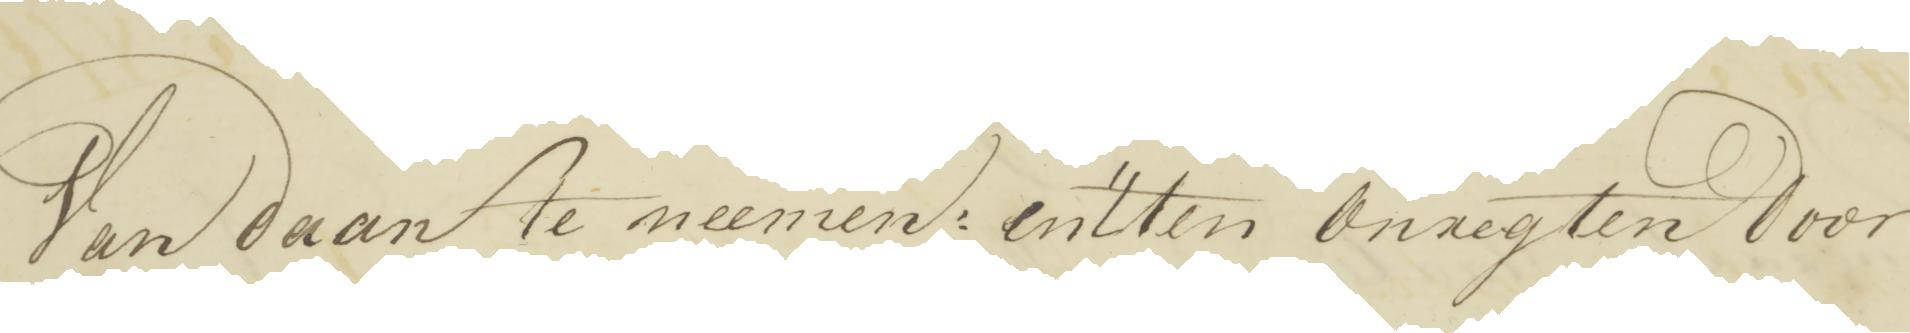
Van daan te neemen: en 't ten onregten door
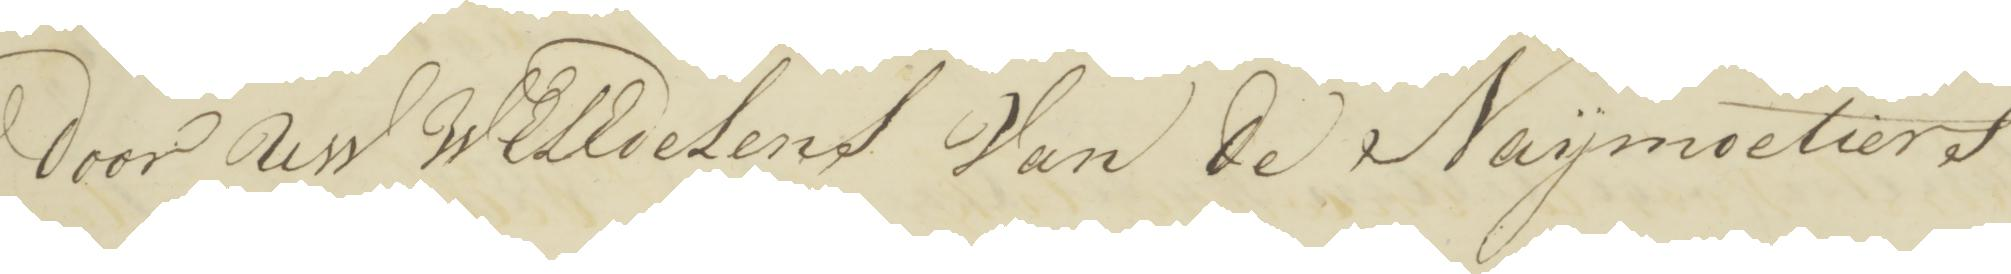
door uw WelEdelens van de Naijmoetiers
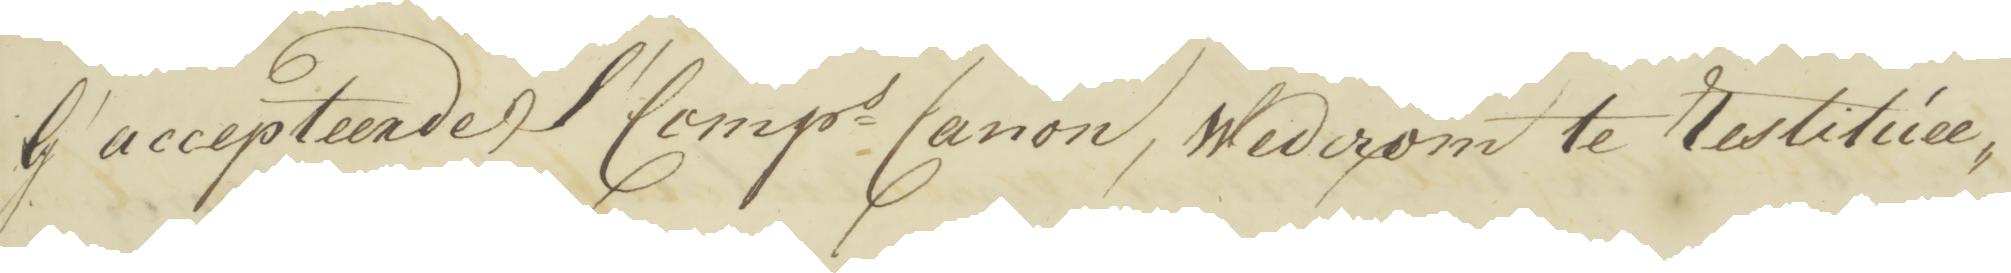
G’accepteerde s' Comp=s Canon, wederom te restituee„
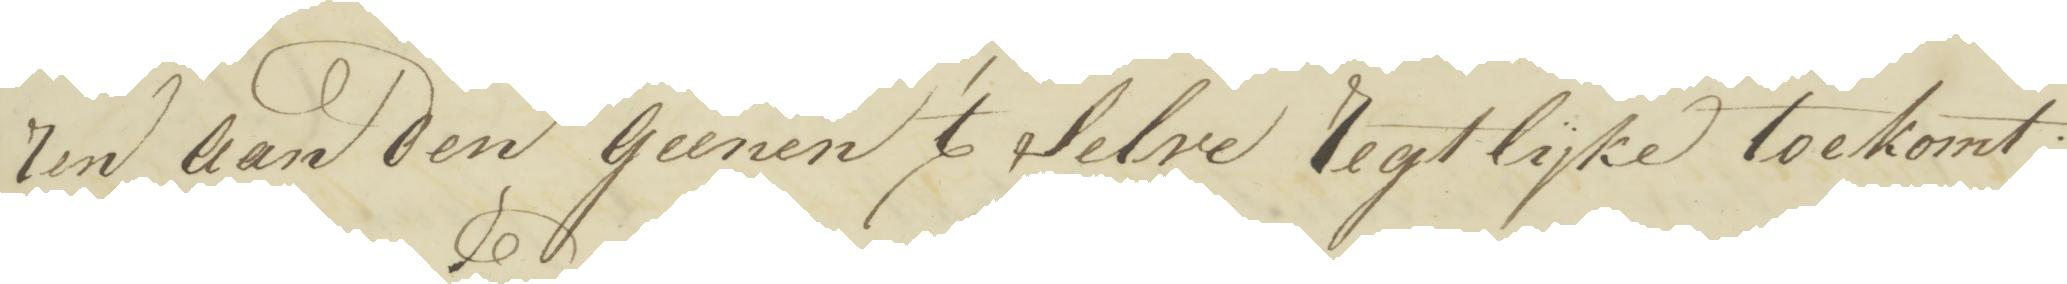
ren aan den geenen ’t selve regtlijke toekomt:
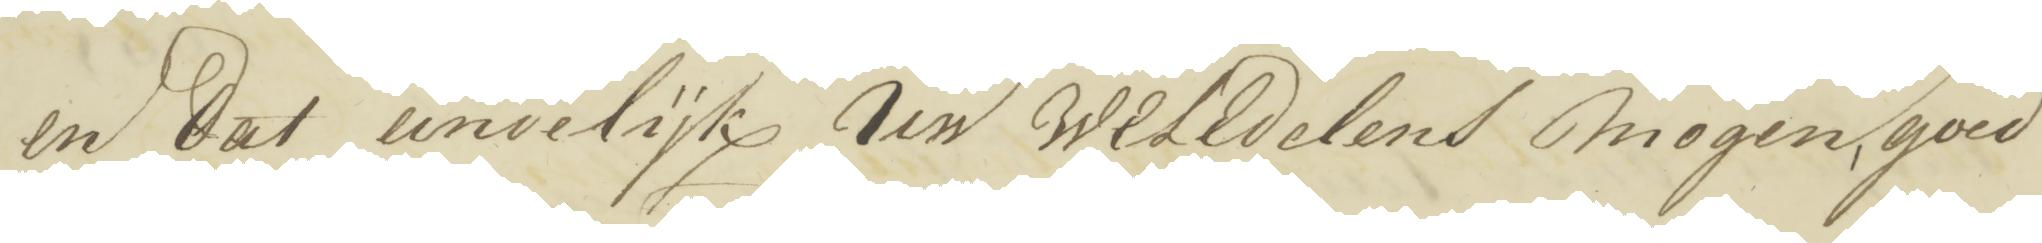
en dat eindelijk uw wel Edelens mogen, goed
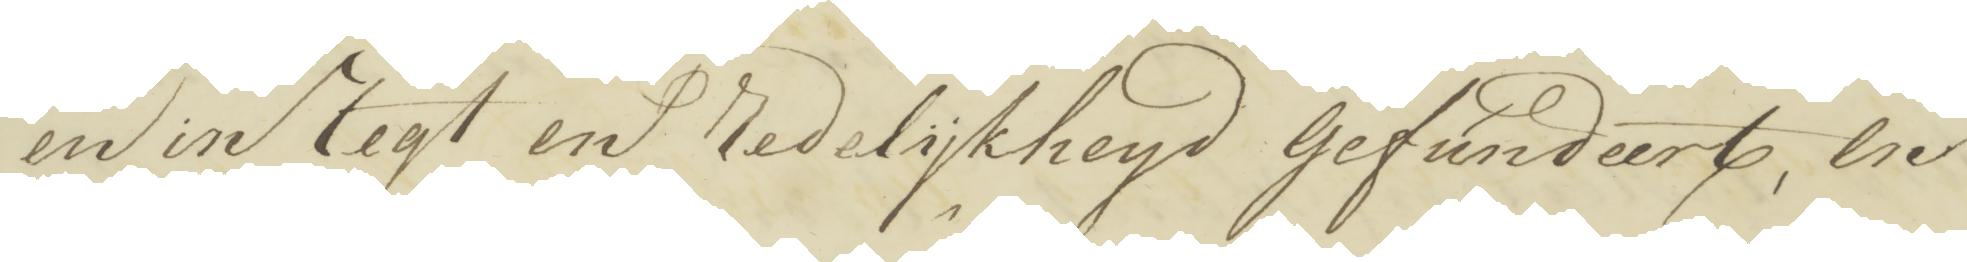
en in regt en redelijkheyd gefundeert, en
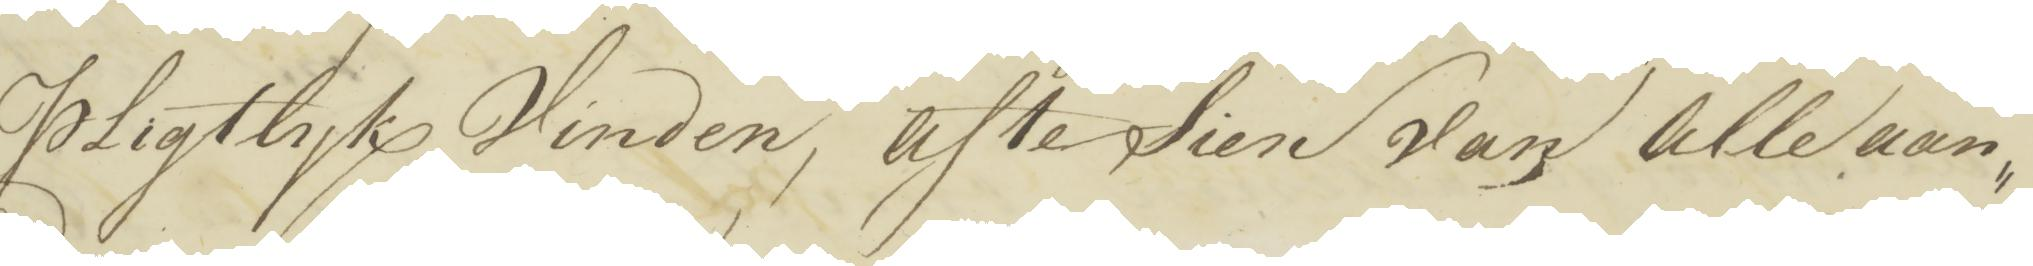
pligtlyk vinden, af te sien van alle aan„
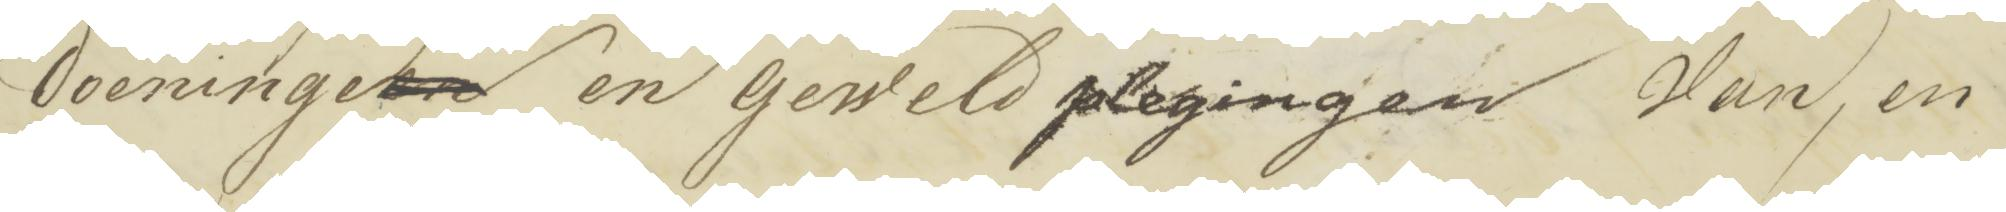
doeningeen en geweld plegingen van, en
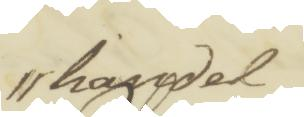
„ handel
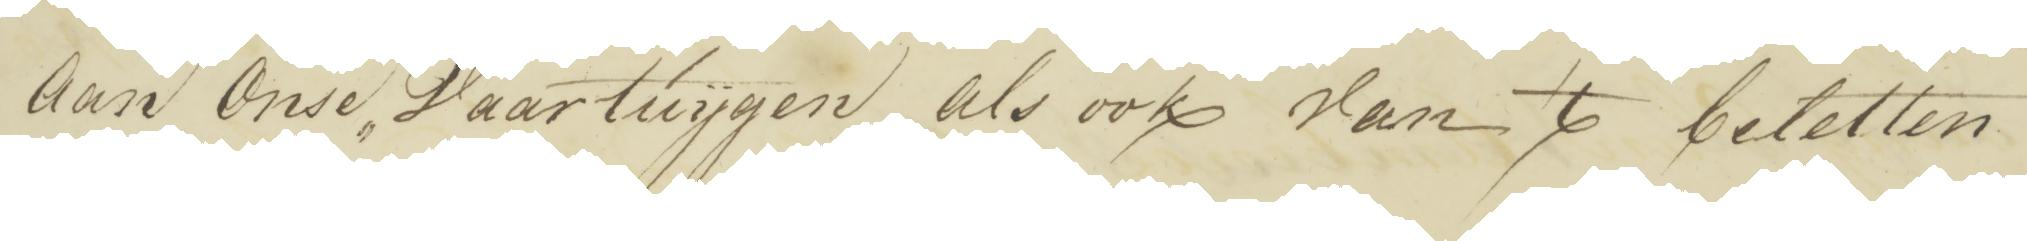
aan onse „ vaartuijgen, als ook van ’t beletten
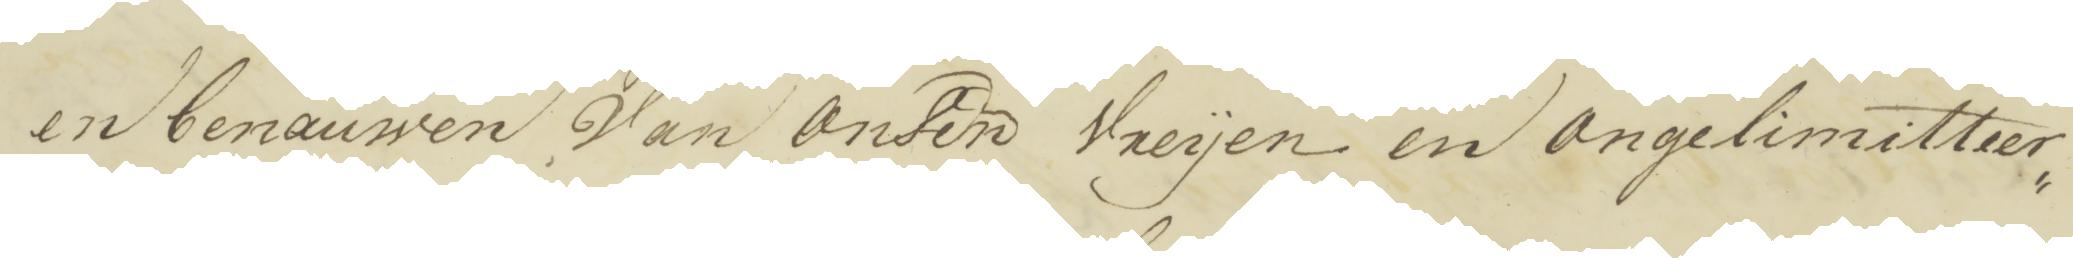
en benauwen van onsen vreijen en ongelimitteer„
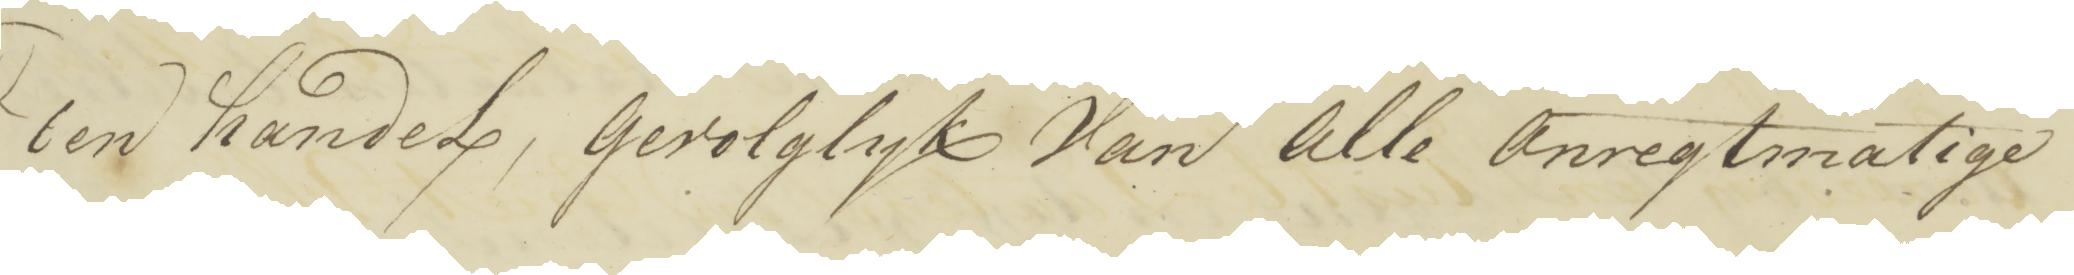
den handel, gevolglyk van alle onregtmatige
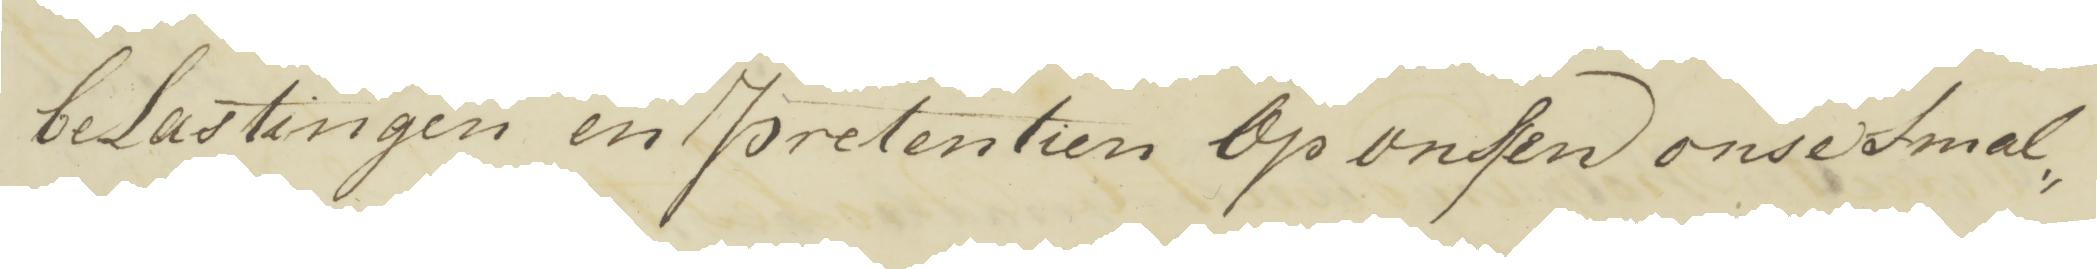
belastingen en pretentien op ons/en onse smal„
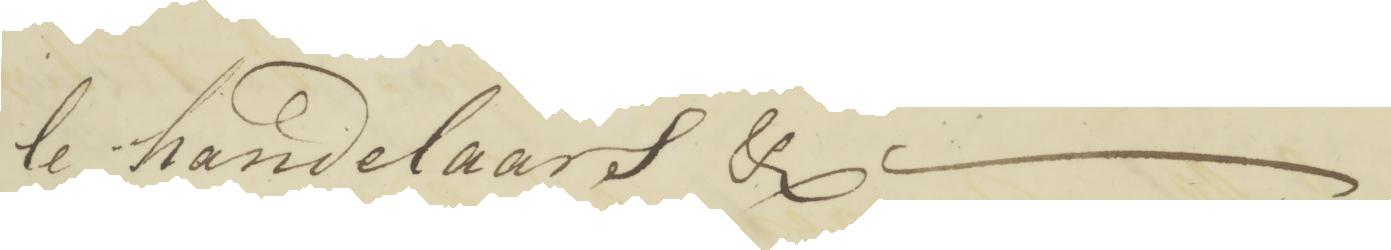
le handelaars & —
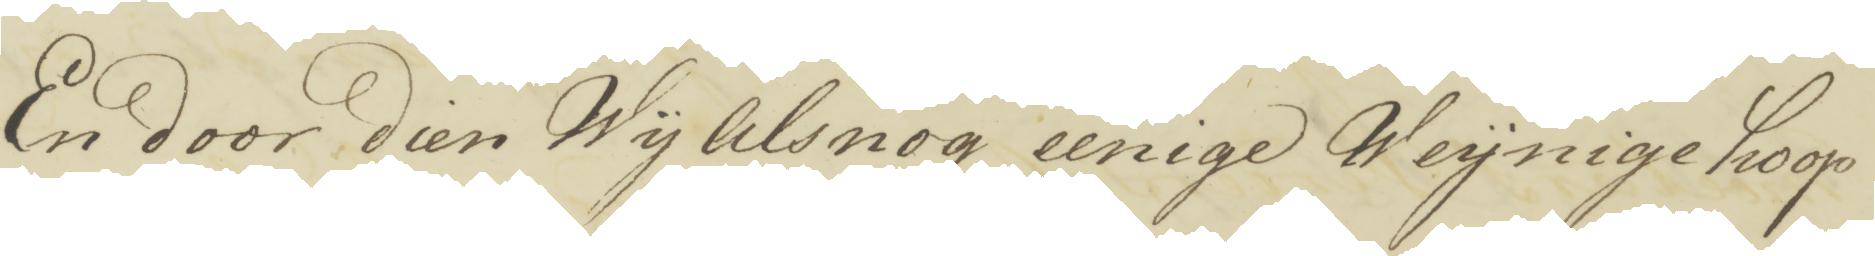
En door dien wij als nog eenige weijnige hoop
